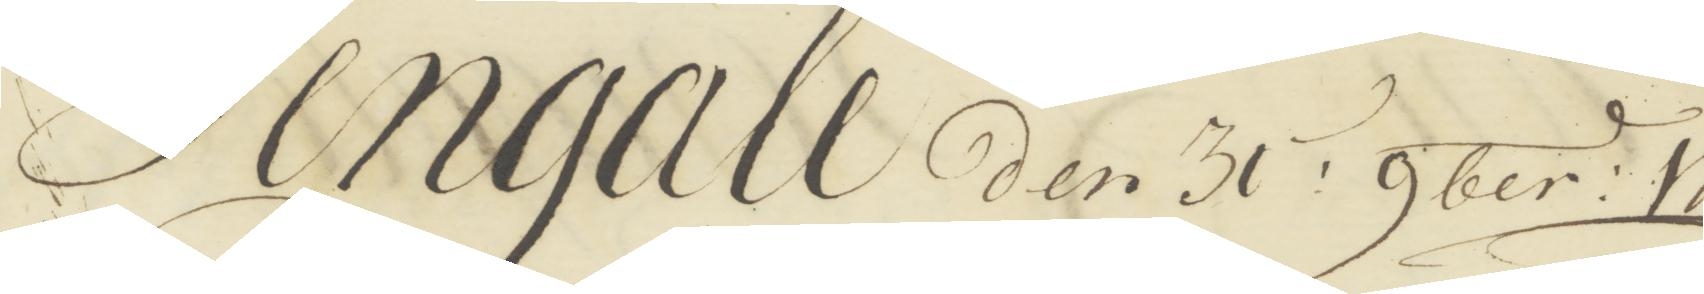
Van Bengale den 31:' 9ber: 1738
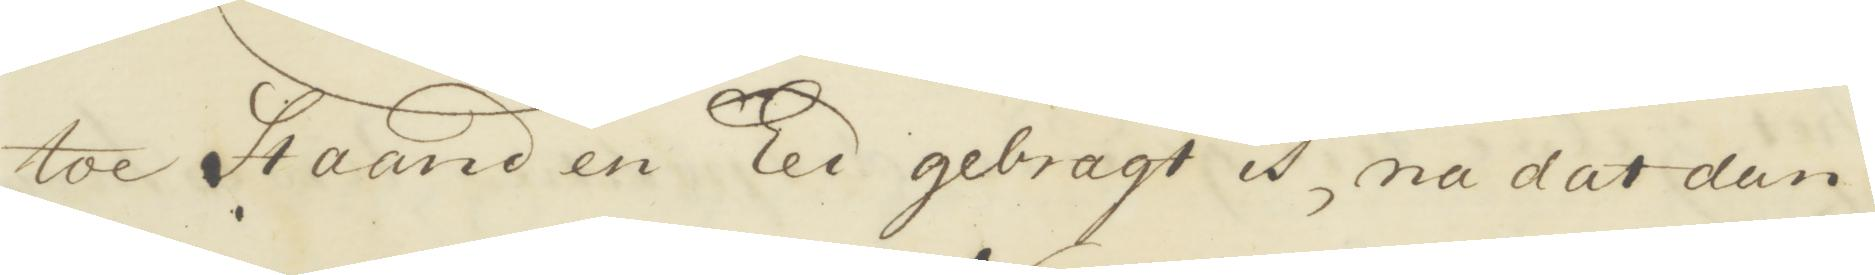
toe staand en hed gebragt is, na dat dan
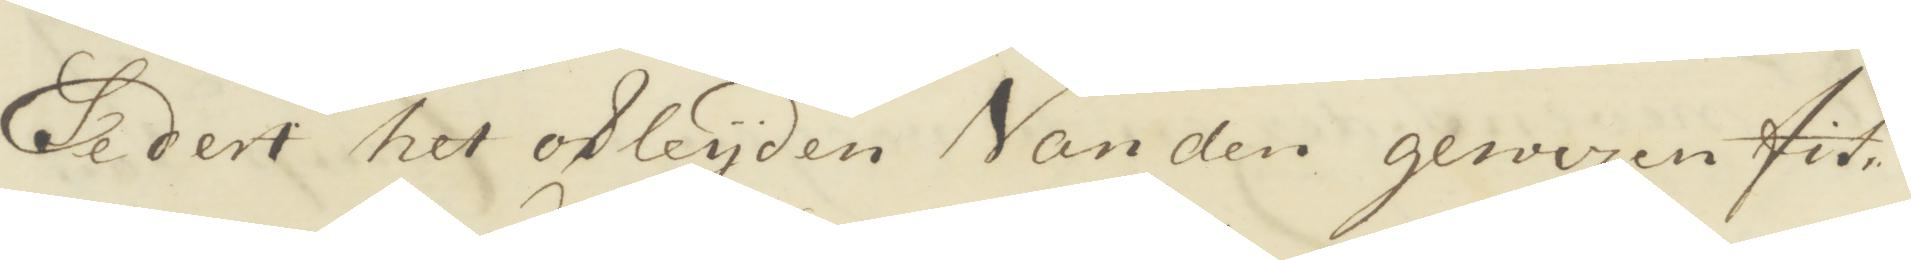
sedert het overleijden van den gewezen fis„
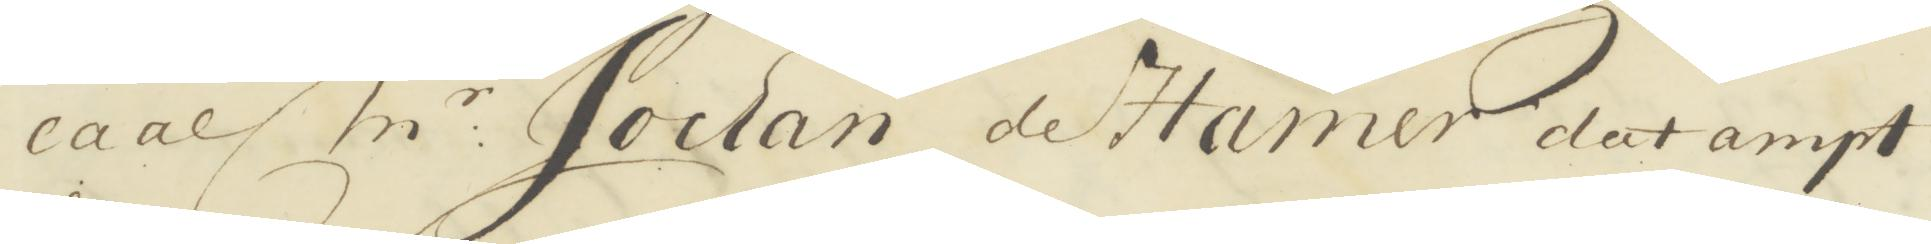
caal m:r Jochan de Hamer dat ampt
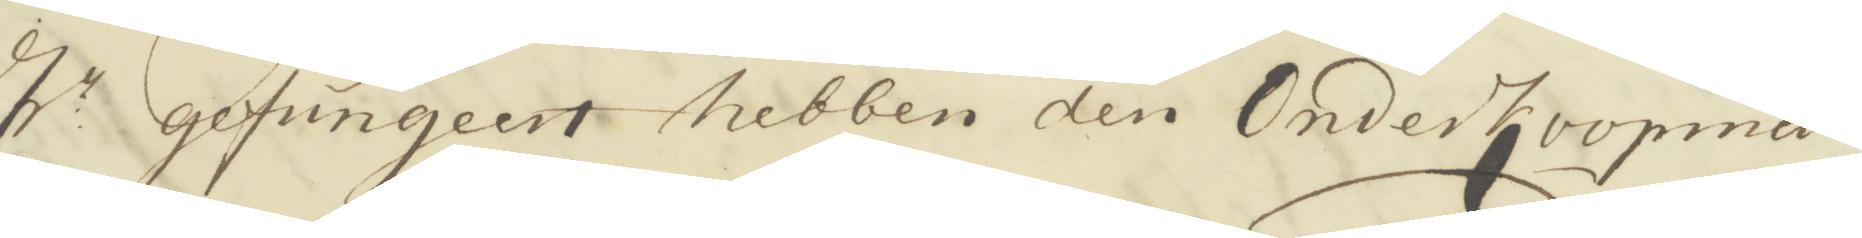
p:r gefungeert hebben den Onderkoopman
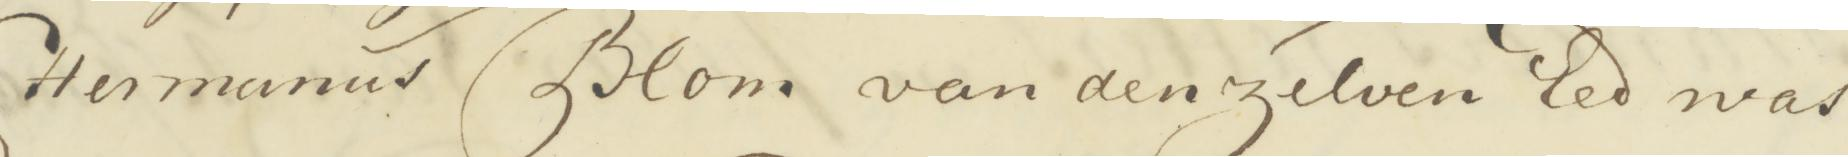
Hermanus Blom van denzelven Eed was
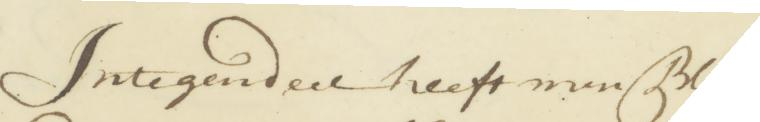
Jntegendeel heeft men Blom
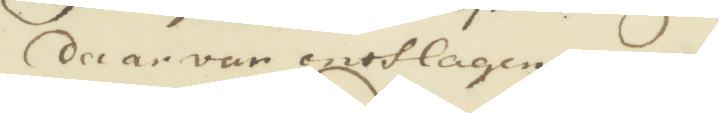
daarvan ontslagen en de
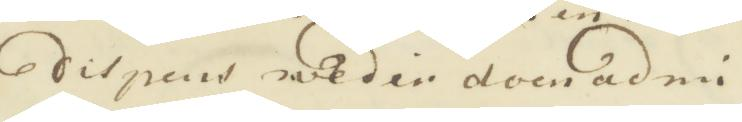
dispens weder doen admi
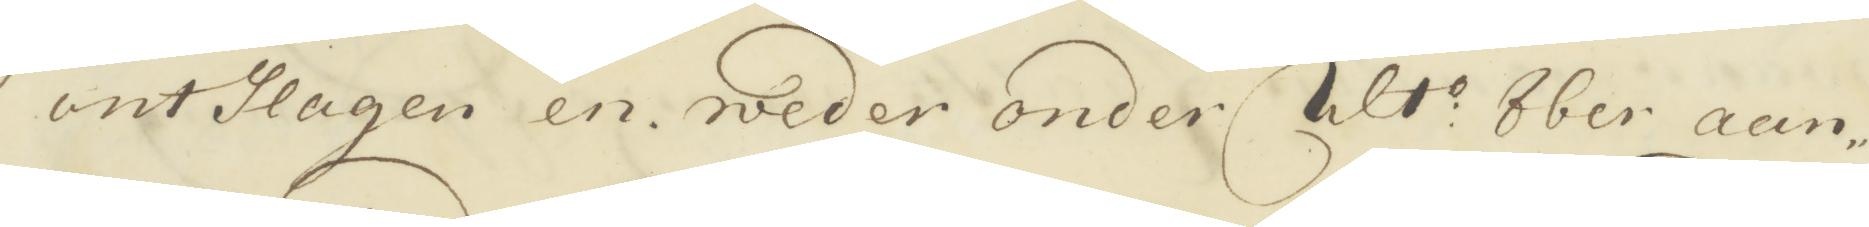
ontslagen en weder onder ult:o 8ber aan„
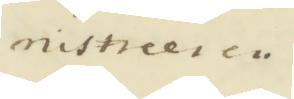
nistreeren
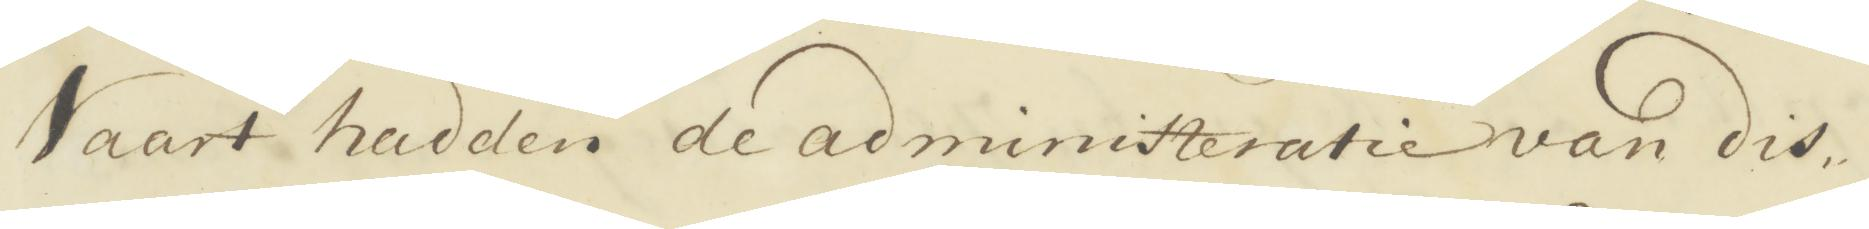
Vaart hadden de administeratie van dis„
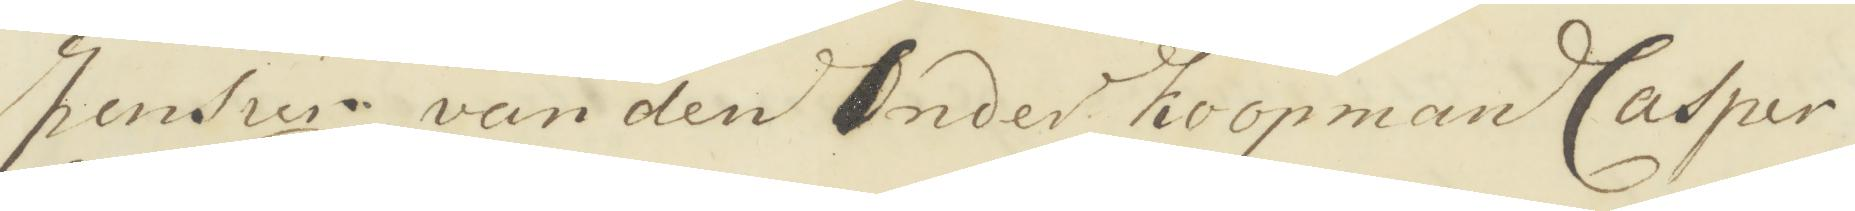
pensier van den Onder Koopman Casper
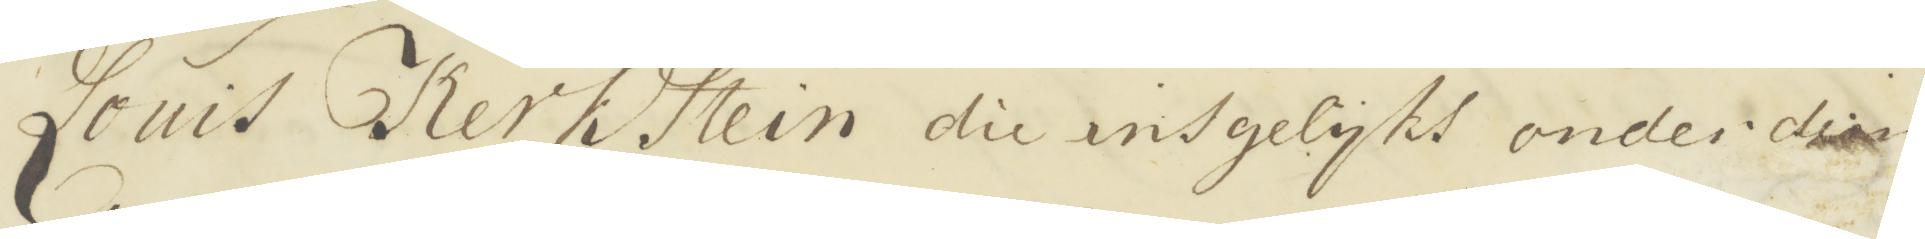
Louis Kerkstein die insgelijks onder dier
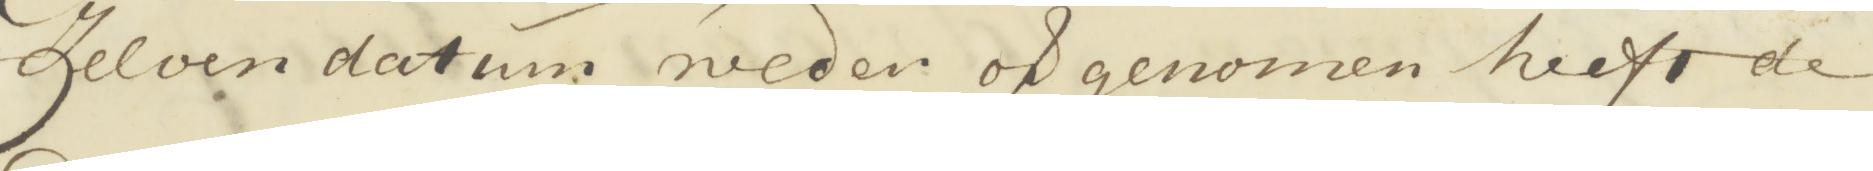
zelven datum weder overgenomen heeft de
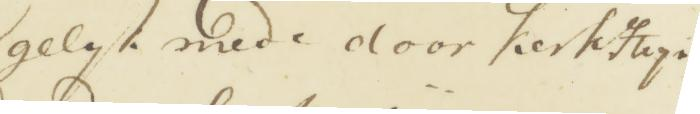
gelyk mede door kerksteyn
